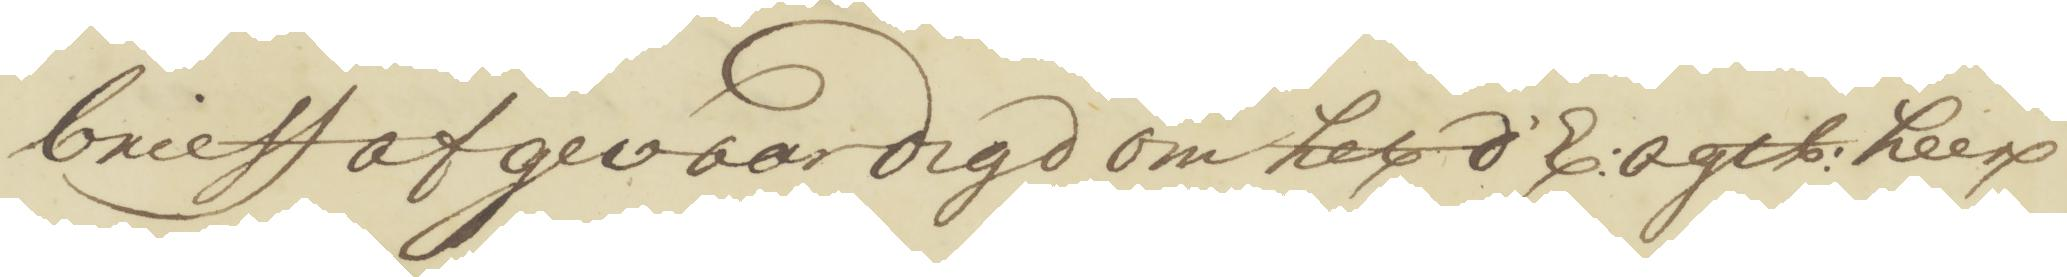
brieff afgevaardigd om het d’ E: agtb: heer
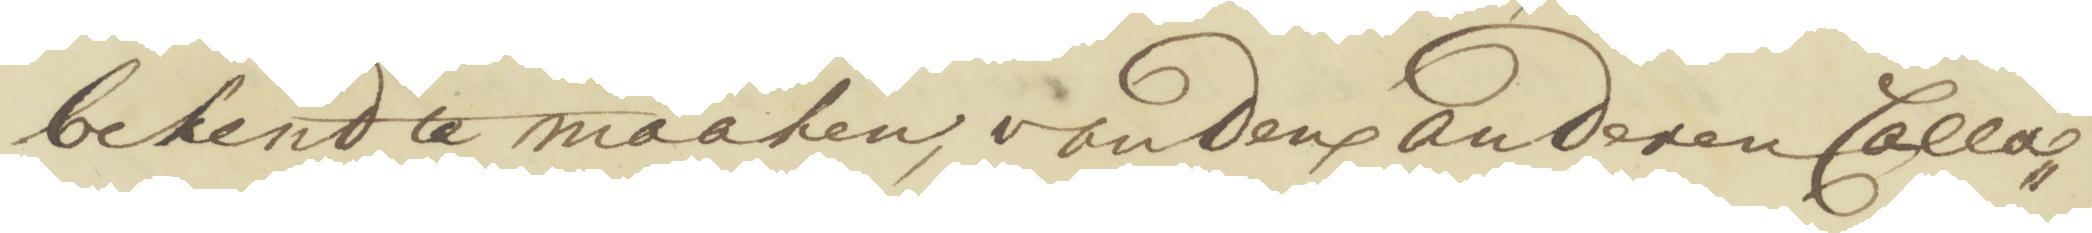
bekend te maaken, van den anderen Calla„
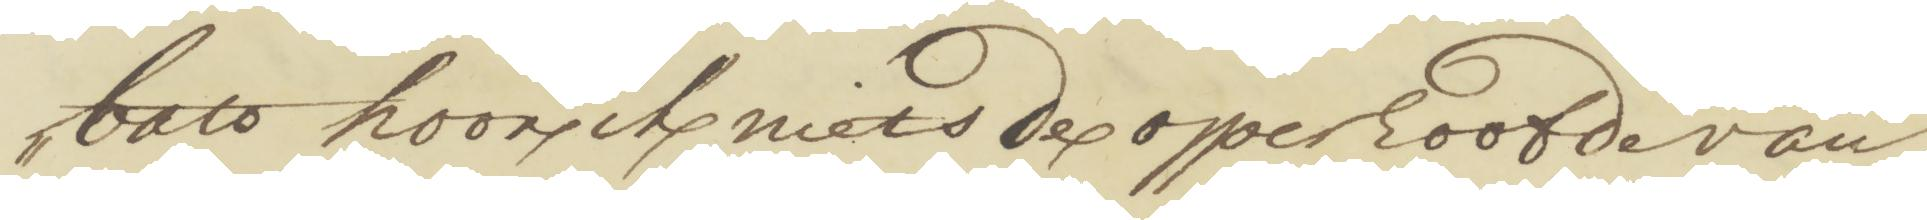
„bato hoor ik niets de opperhoofde van
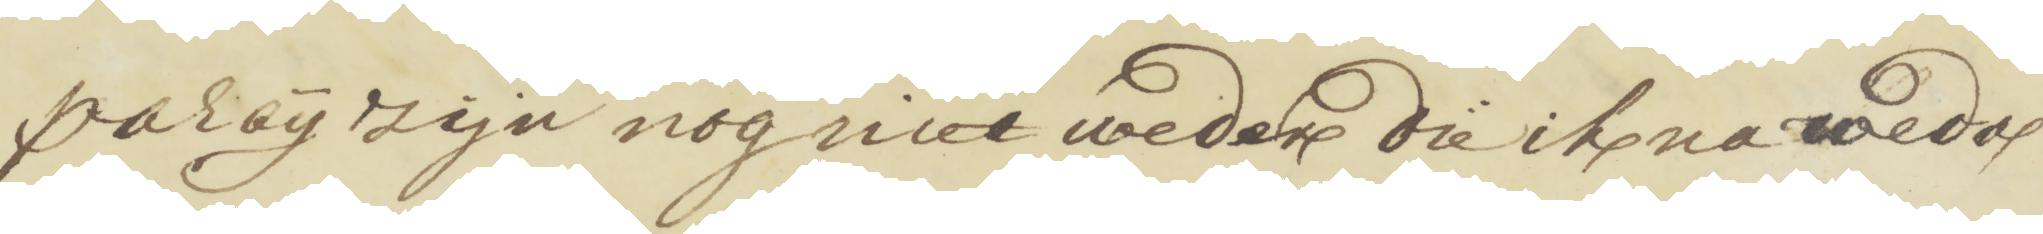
pahaij zijn nog niet weder die ik na weda
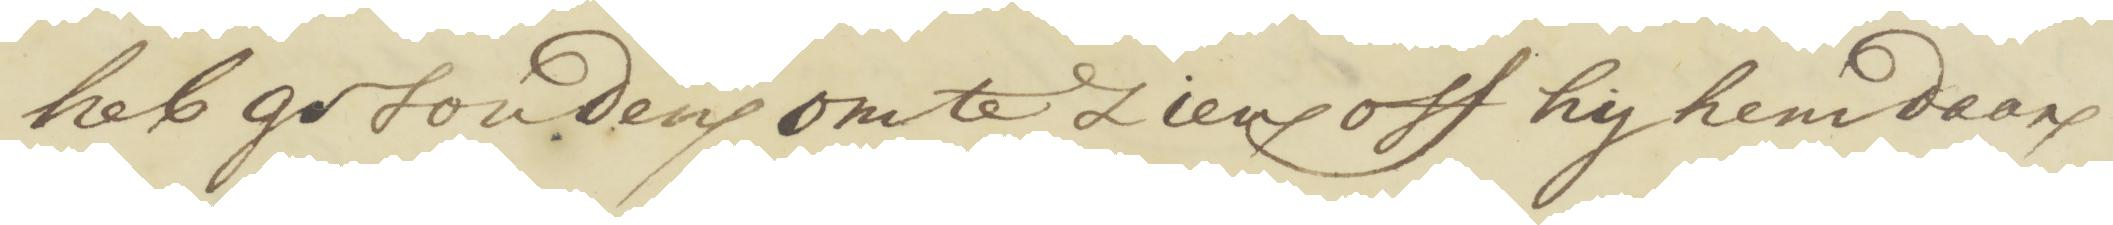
heb gesonden om te zien off hij hem daar
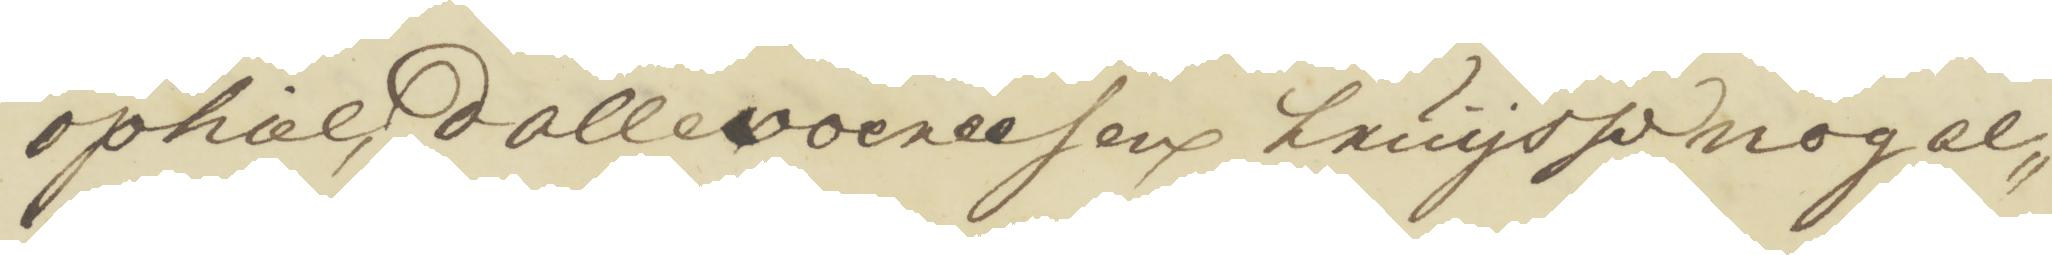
ophiel d allevoereesen kruijsse nog al„
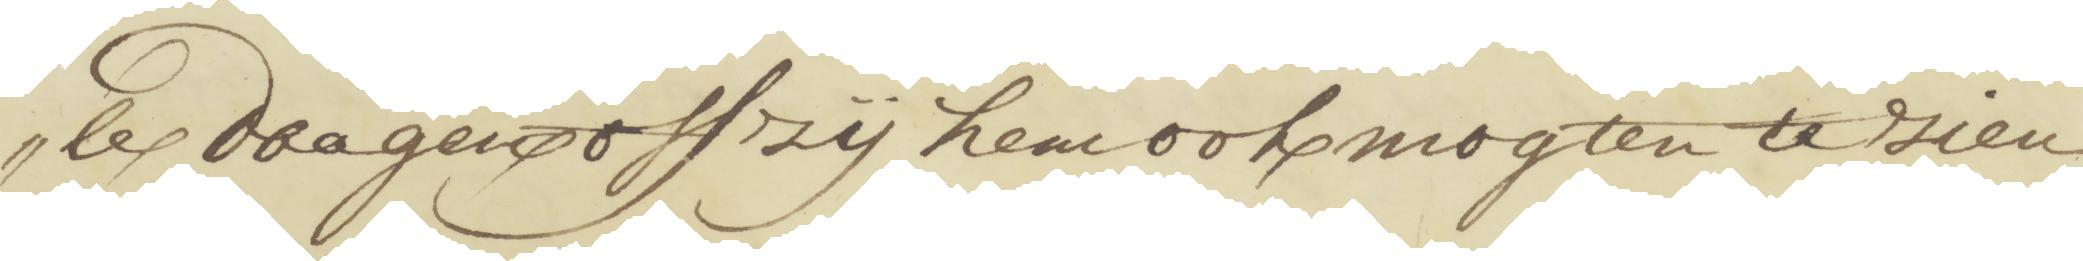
„le daagen off zij hem ook mogten te zien
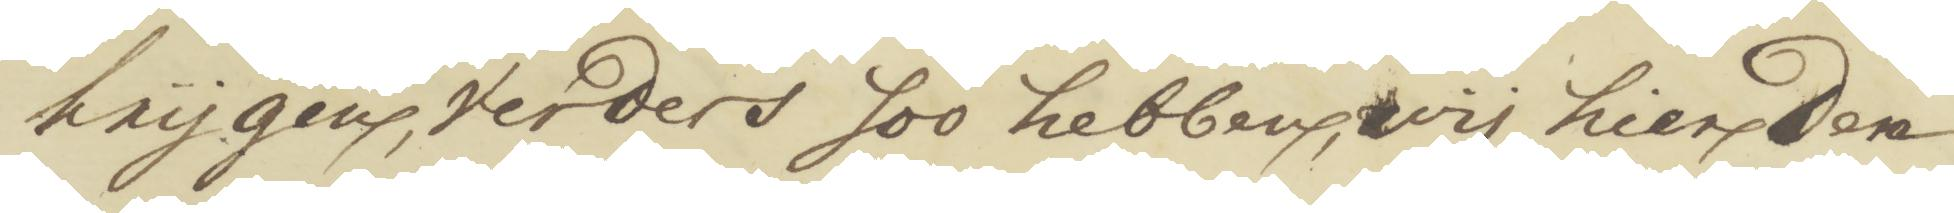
krijgen, verders soo hebben, wij hier den
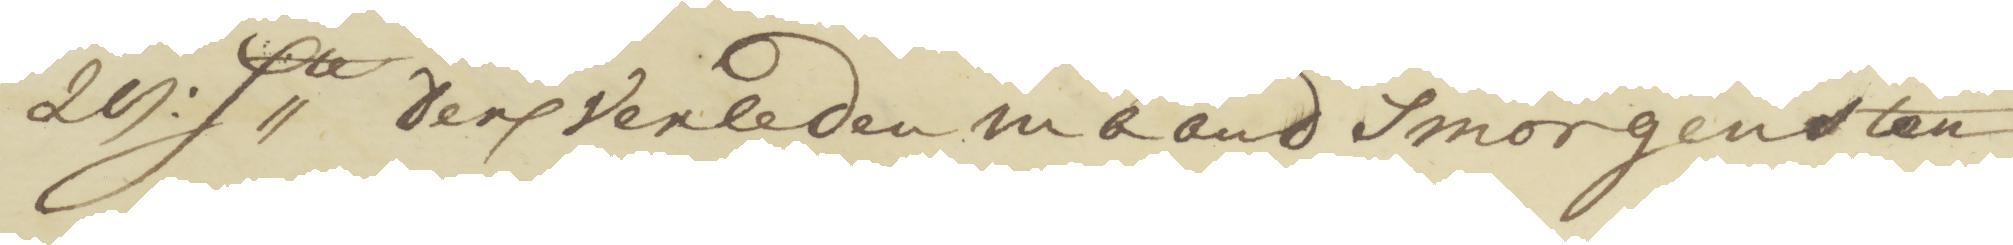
28: S„te der verleden maand s morgens ten
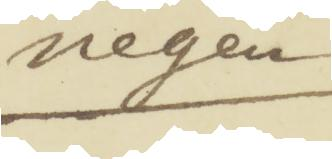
negen
